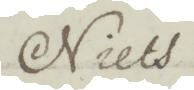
Niets
